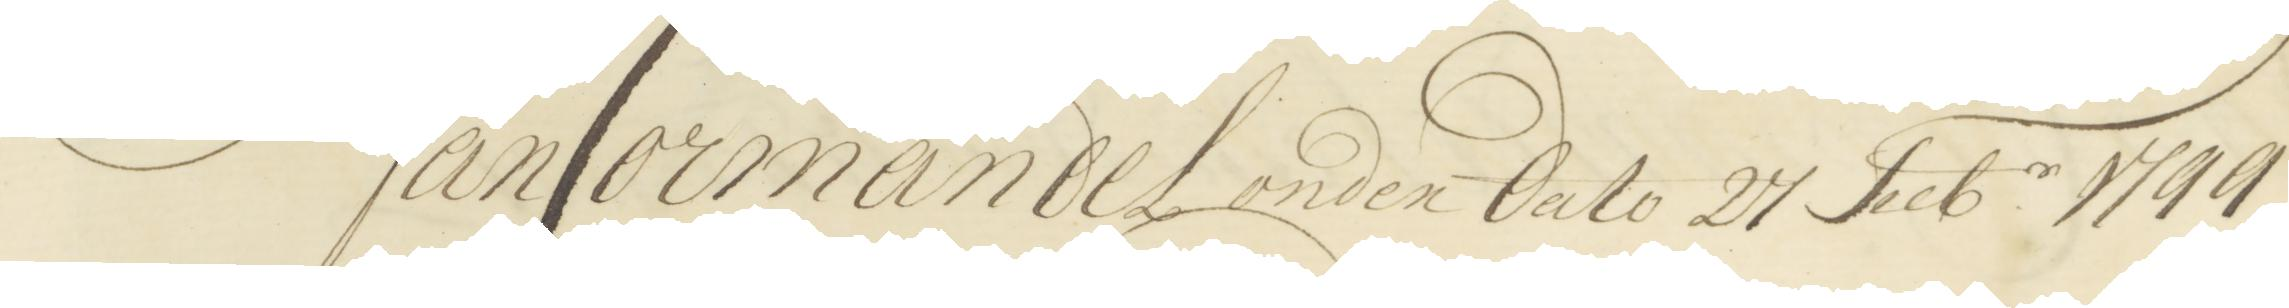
Van Cormandel onder dato 27 Feb.r 1744
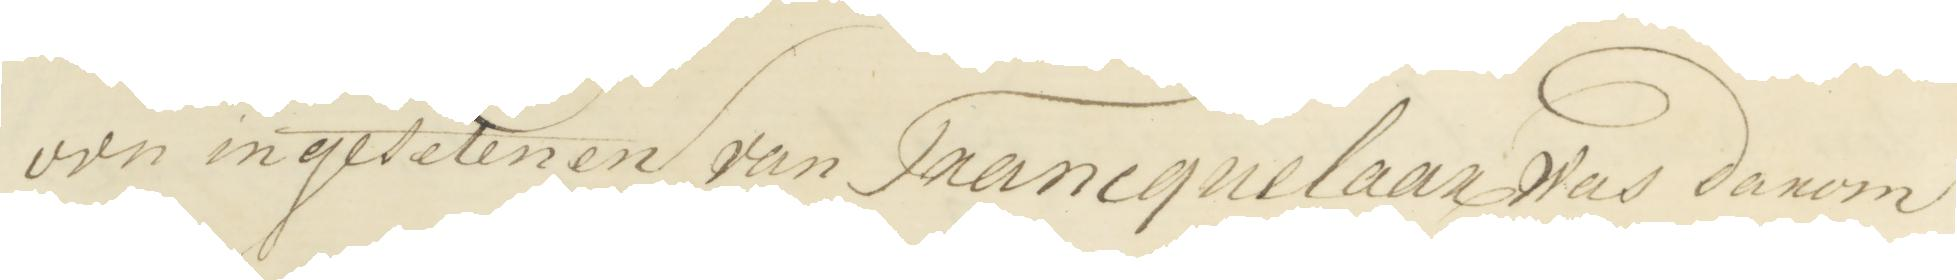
een ingesetenen van Trancquelaar was darom
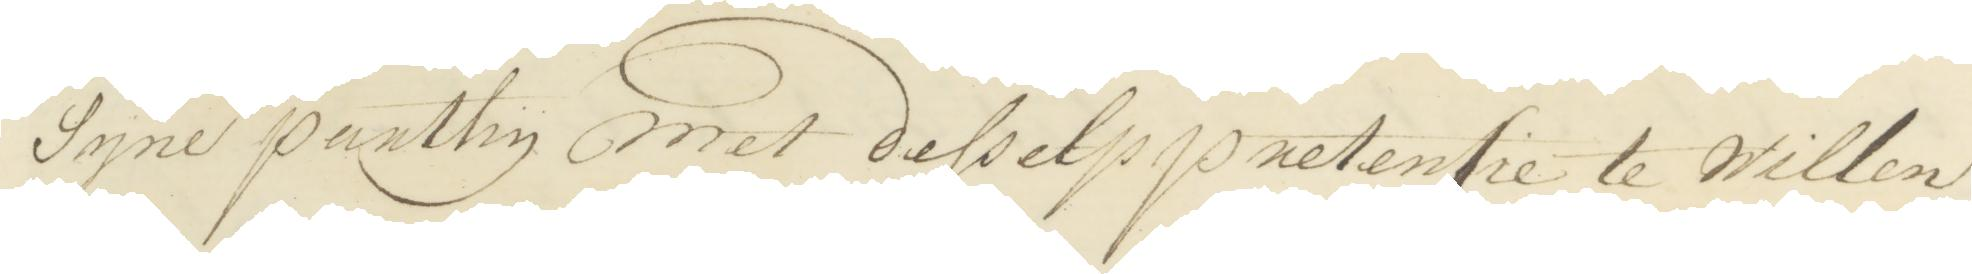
sijne parthij met desselfs pretensie te willen
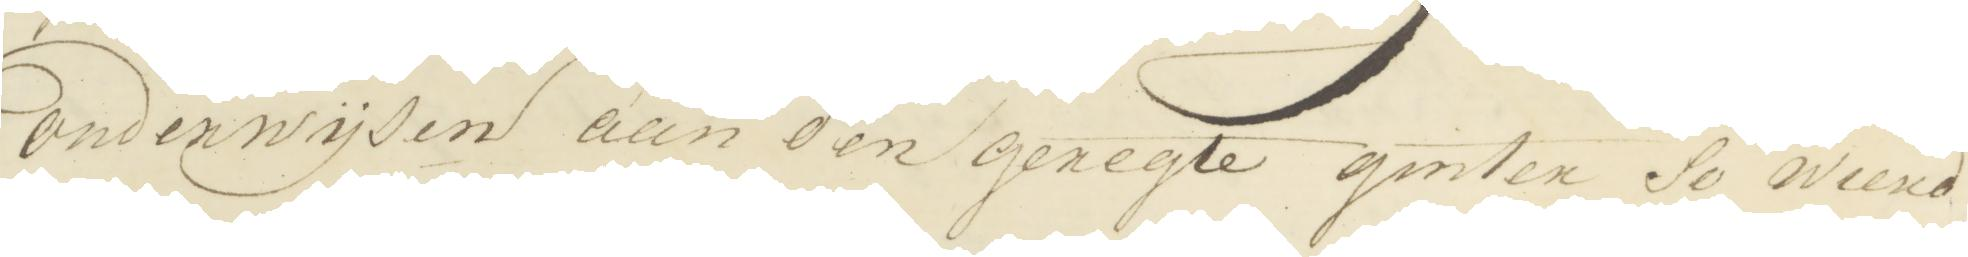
onderwijsen aan den geregte ginter so wierd
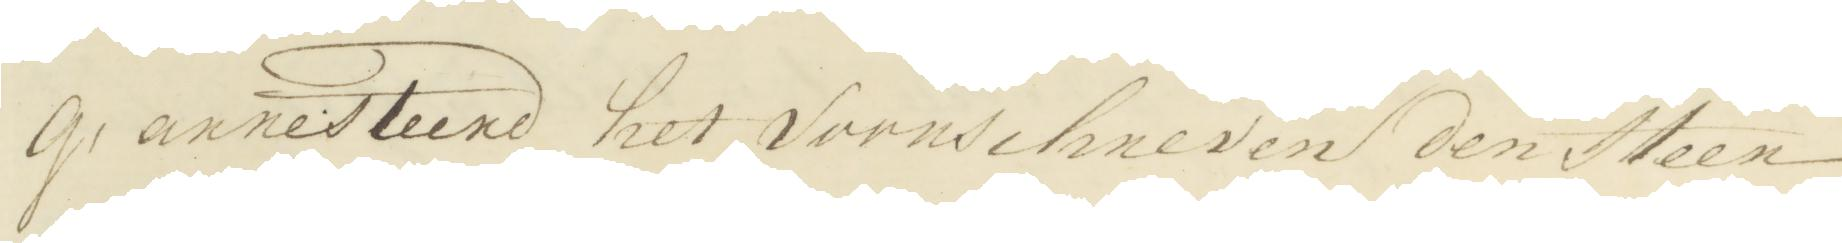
g, arresteerd het voorschreven den Heer
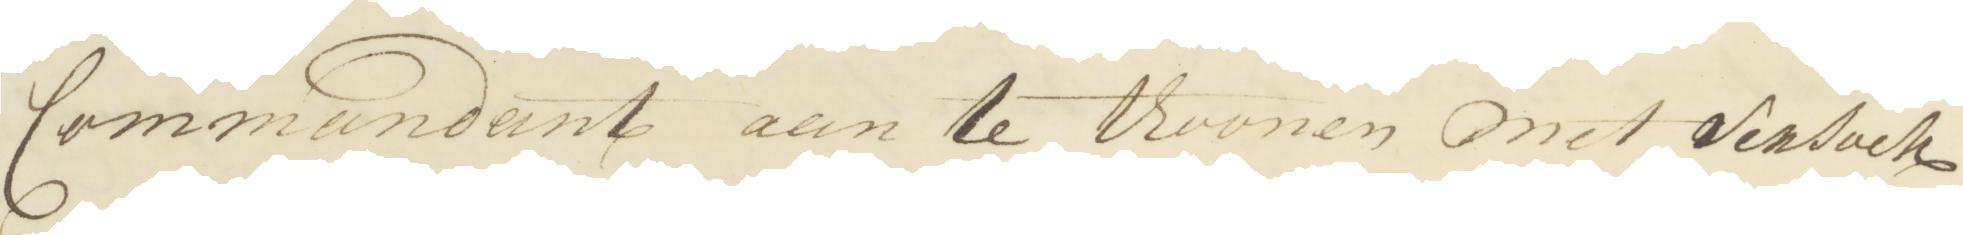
Commandant aan te thoonen met versoek
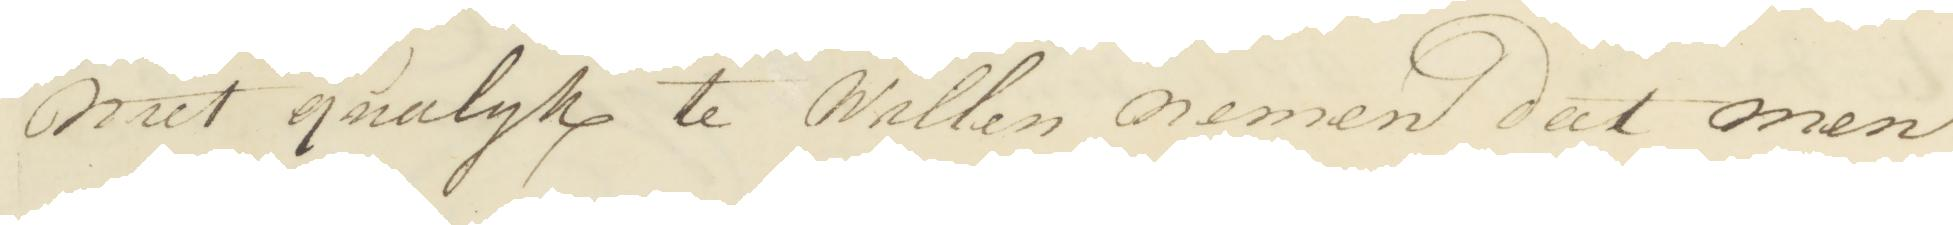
niet qualijk te willen nemen dat men
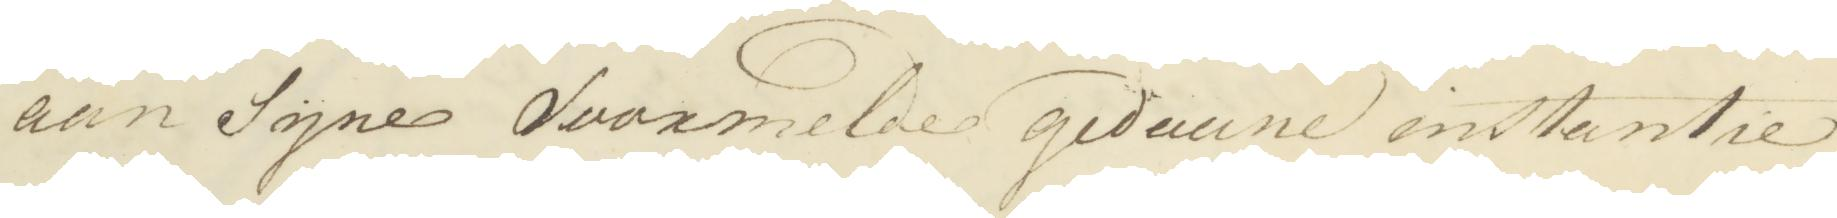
aan sijne voormelde gedaane instantie
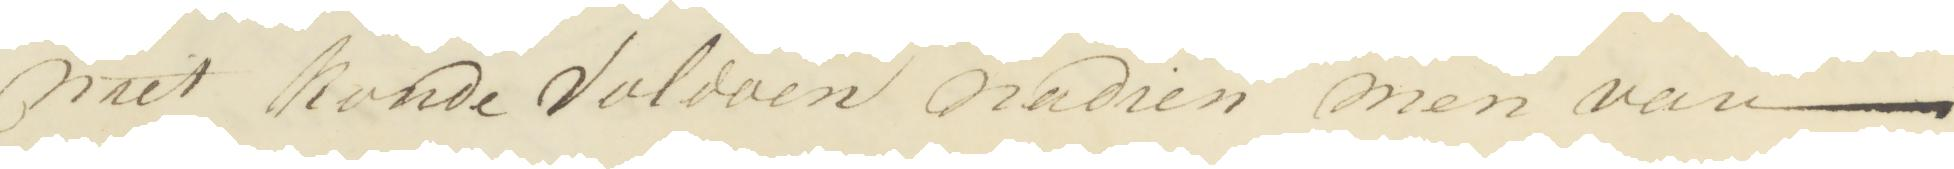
niet konde voldoen nadien men van
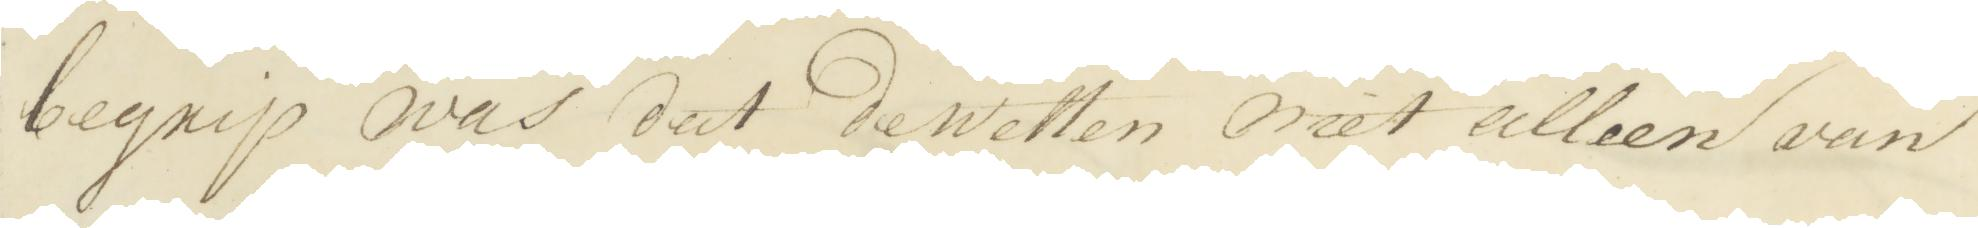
begrip was dat dewetten niet alleen van
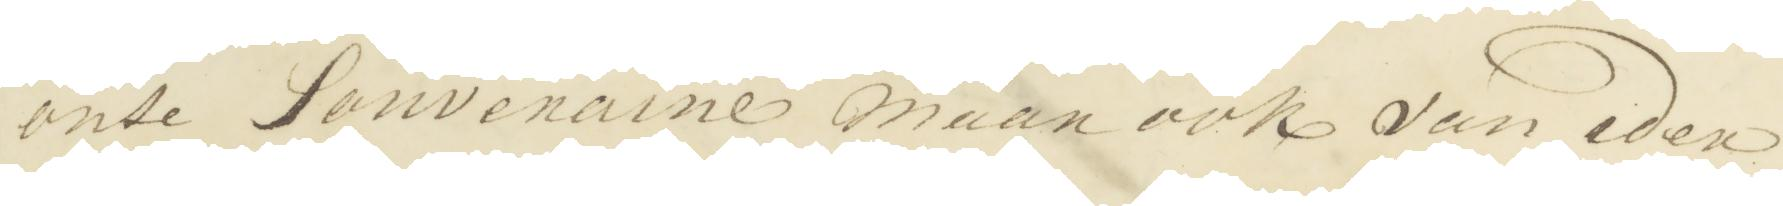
onse souveraine maar ook van ider
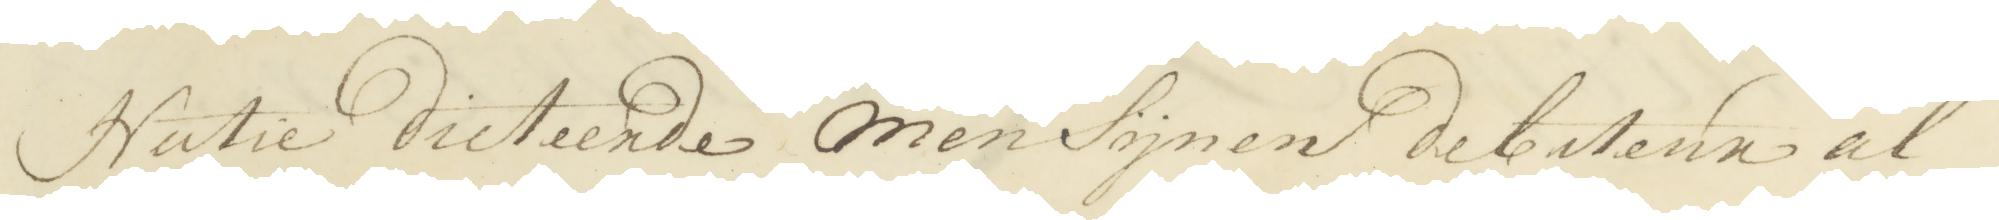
Natie dicteerde men sijnen debiteur al
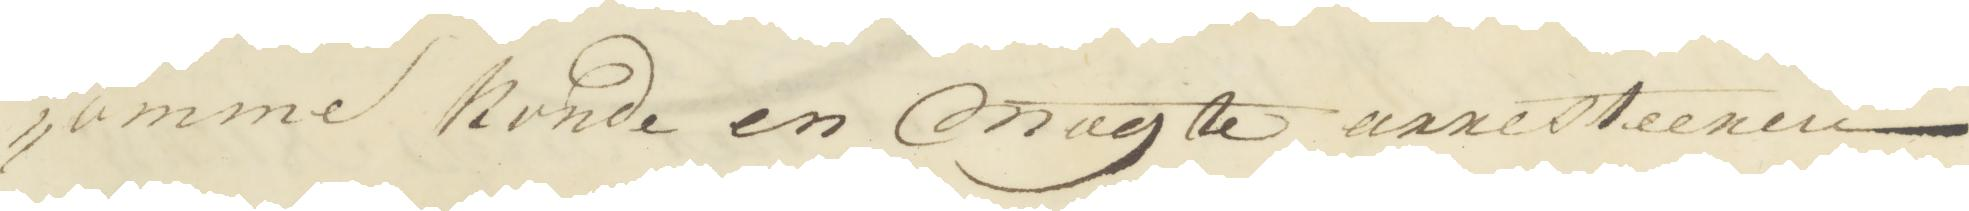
omme konde en mogte arresteeren
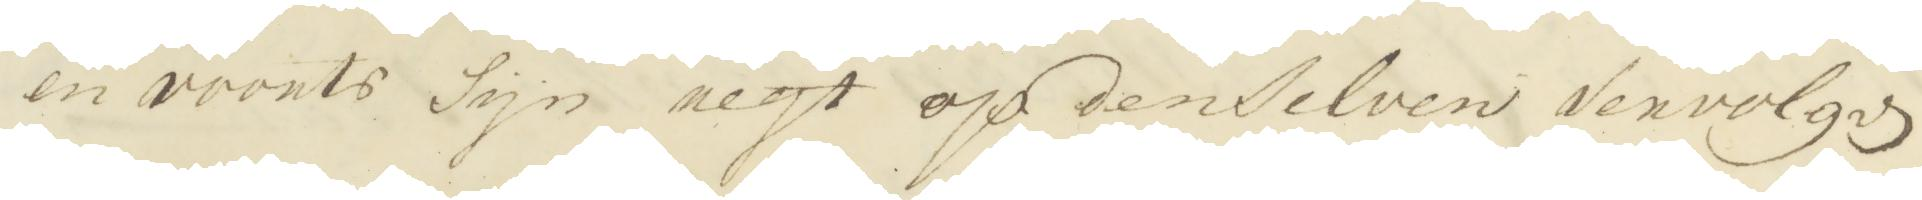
en voorts sijn regt op denselven vervolgen
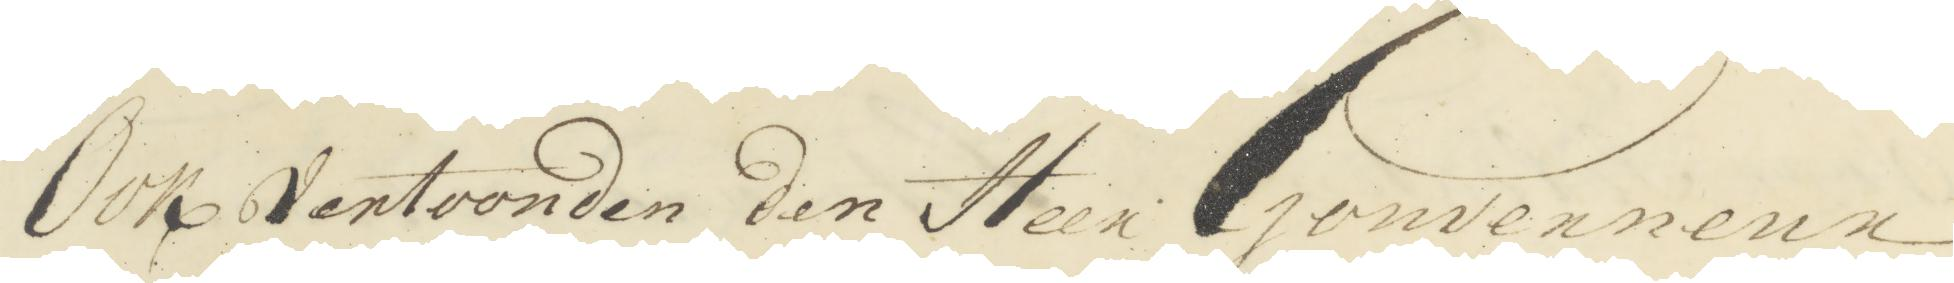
Ook vertoonden den Heer Gouverneur
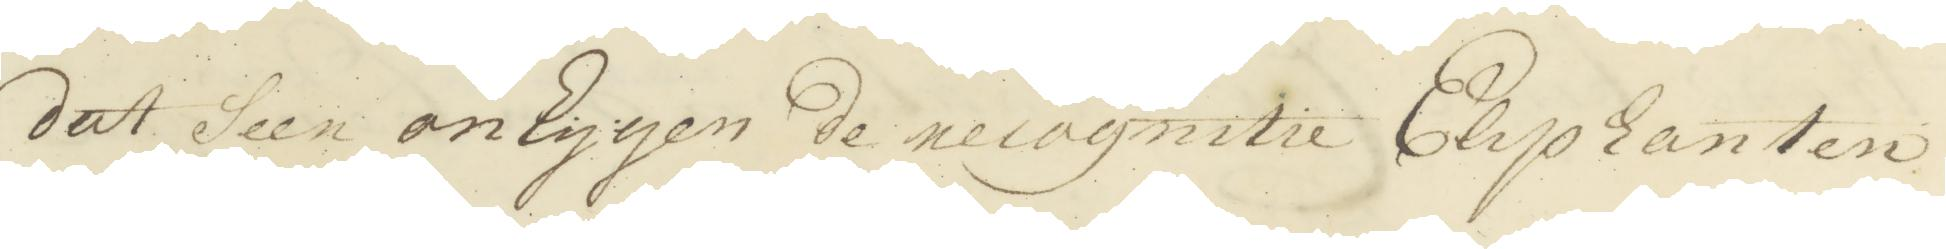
dat seer onEijgen de recognitie Eliphanten
